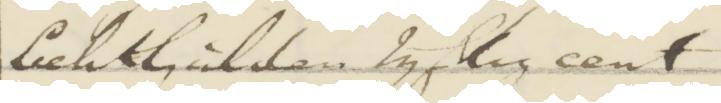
Acht Gulden Vyftig cent
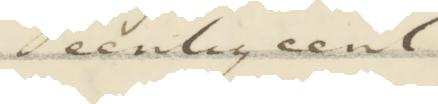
Veertig cent
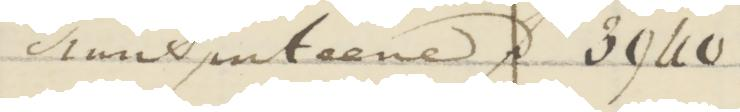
Transport eene ƒ 3940
